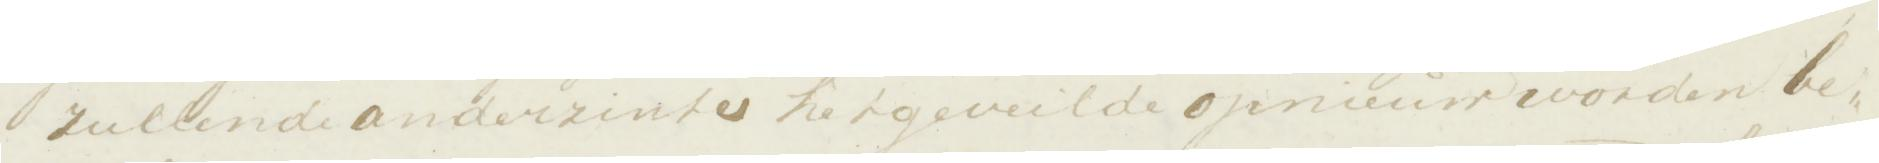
zullende anderzints het geveilde opnieuw worden be„
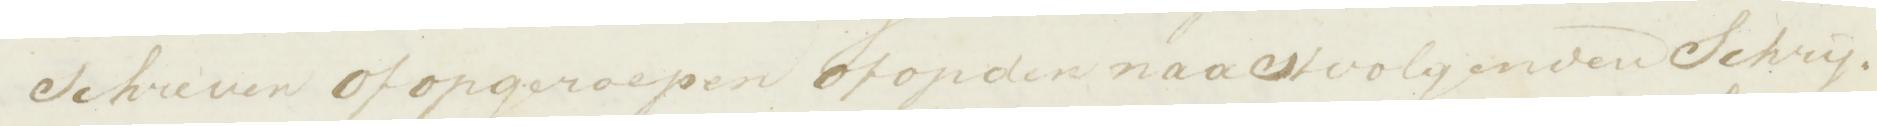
schreven of opgeroepen of op den naastvolgenden schrij„
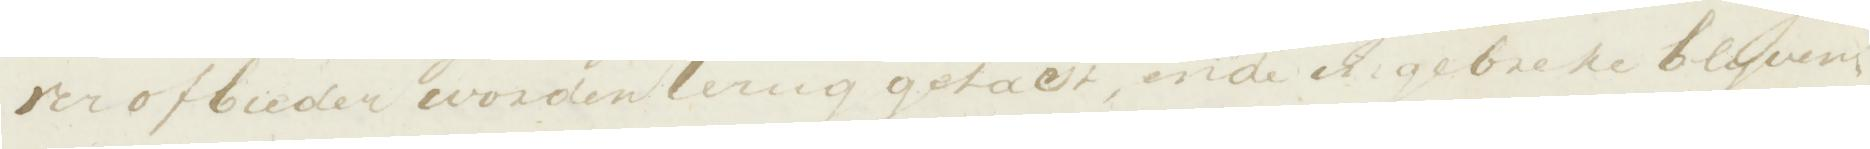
ver of bieder worden terug getast, ende ingebreke blyven
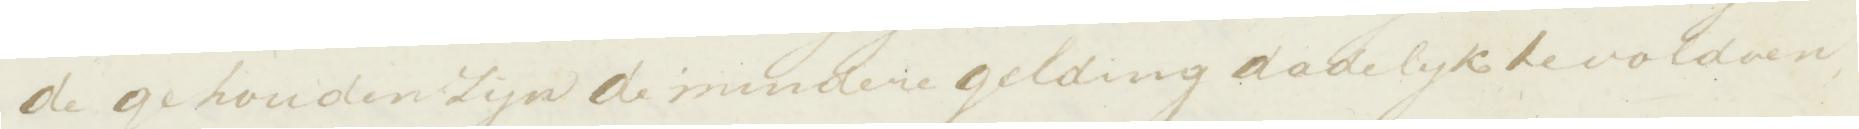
de gehouden zijn de mindere gelding dadelijk te voldoen,
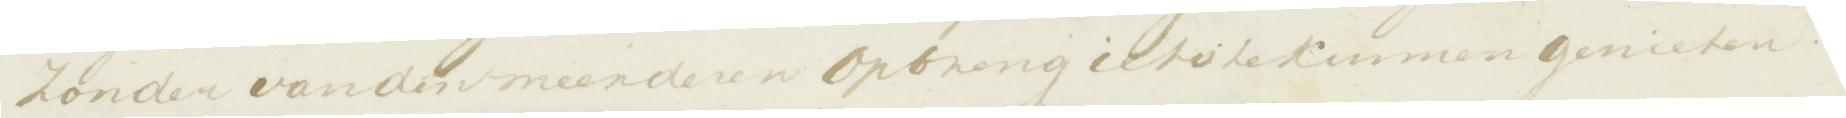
zonder van den meerderen Opbreng iets te kunnen genieten.
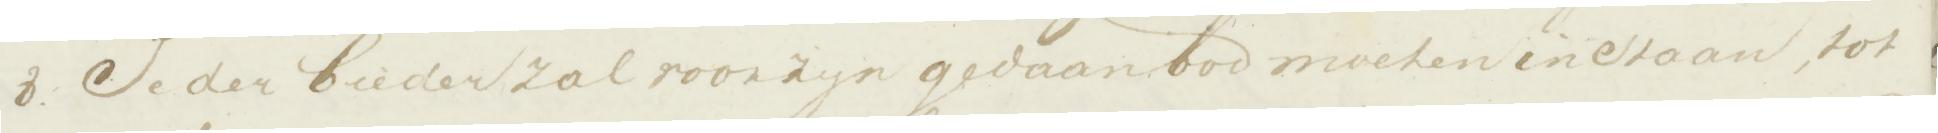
8: Ieder bieder zal voorzijn gedaan bod moeten instaan, tot
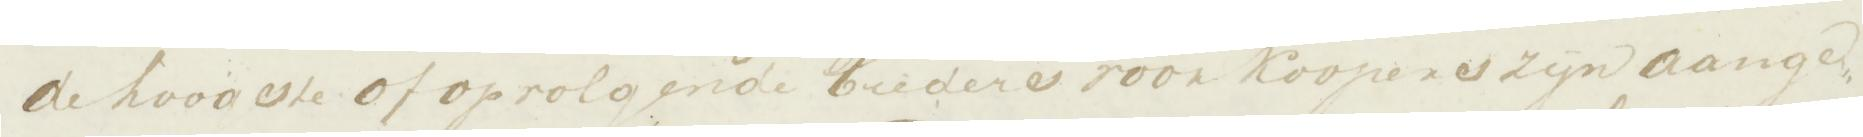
de hoogste of opvolgende bieders voor koopers zijn aange„
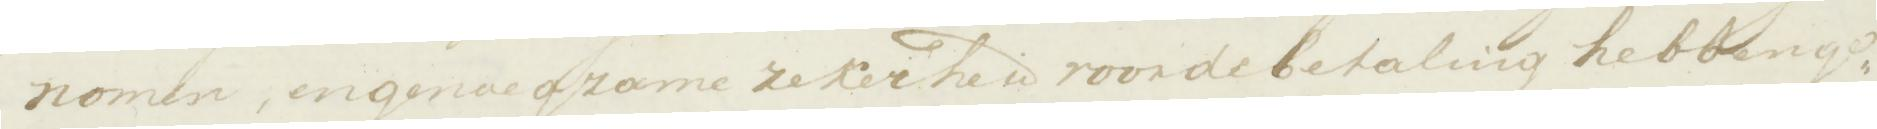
nomen, en genoegzame zekerheid voor de betaling hebben ge„
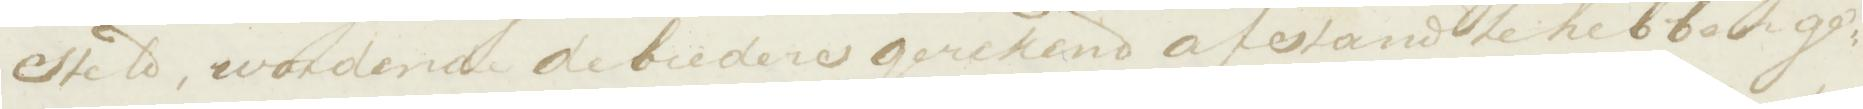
steld, wordende de bieders gerekend afstand te hebben ge„
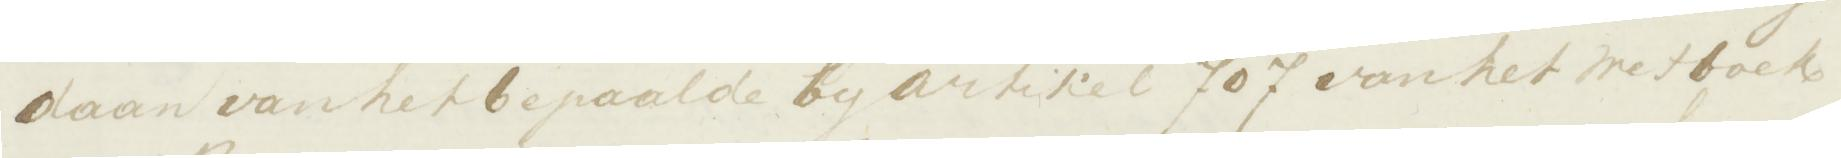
daan van het bepaalde by artikel 707 van het wetboek
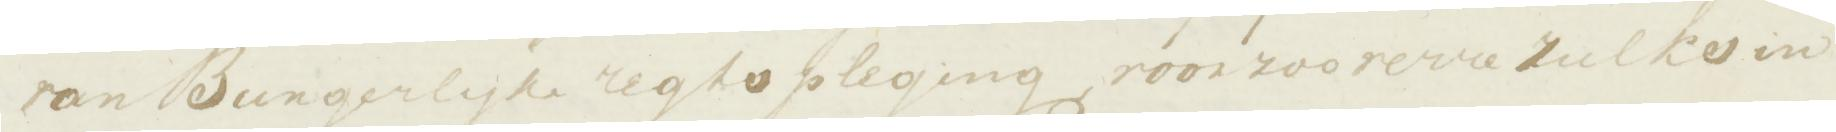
van Burgerlijke regtspleging, voor zoo verre zulks in
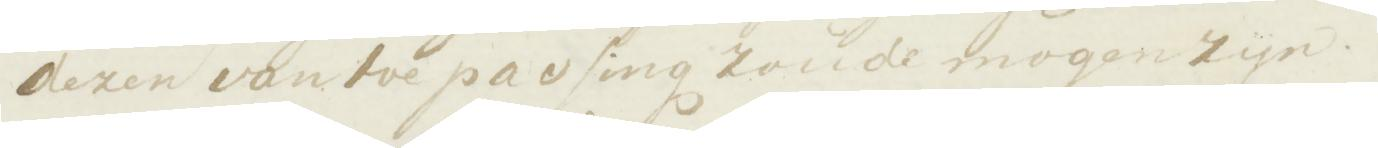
dezen van toepassing zoude mogen zijn.
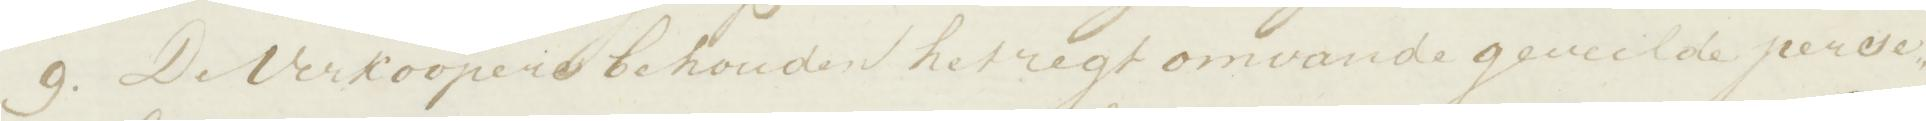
9. De Verkoopers behouden het regt om van de geveilde perse„
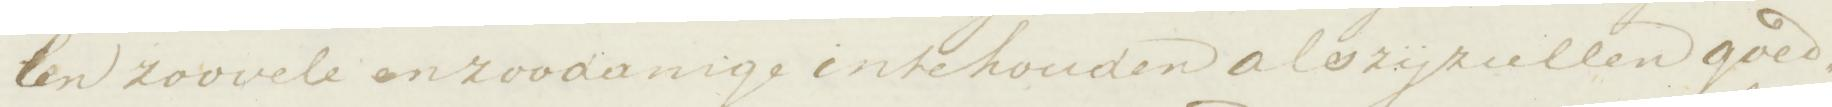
len zoovele en zoodanige intehouden als zij zullen goed„
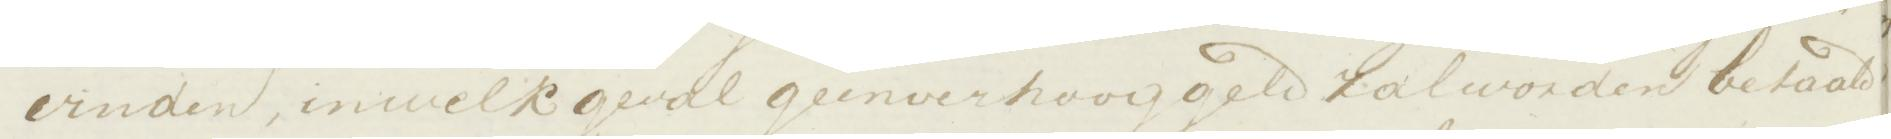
vinden, in welk geval geen verhooggeld zal worden betaald
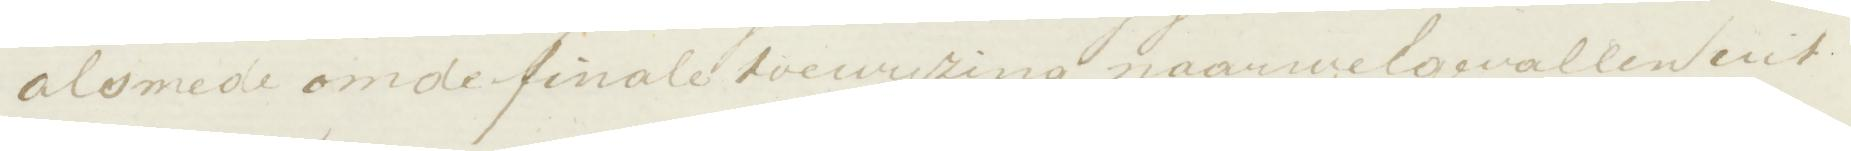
alsmede om de finale toewyzing naarwelgevallen uit
